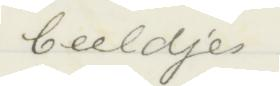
beeldjes
